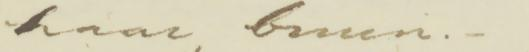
haar, bruin.—
